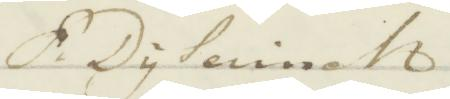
P: Dijserinck
